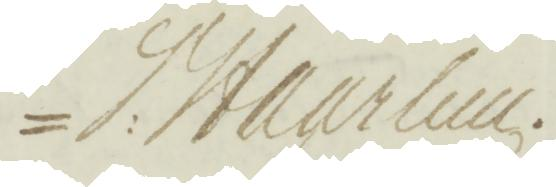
=I: Haarlem
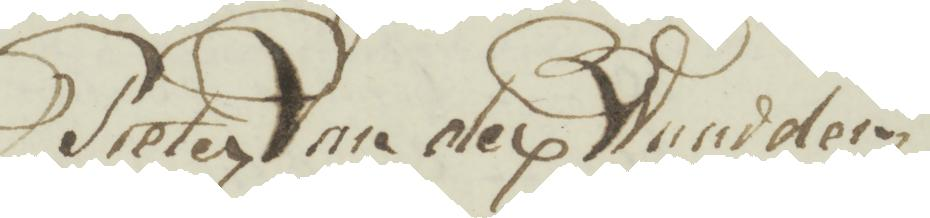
Pieder van der Waarden
